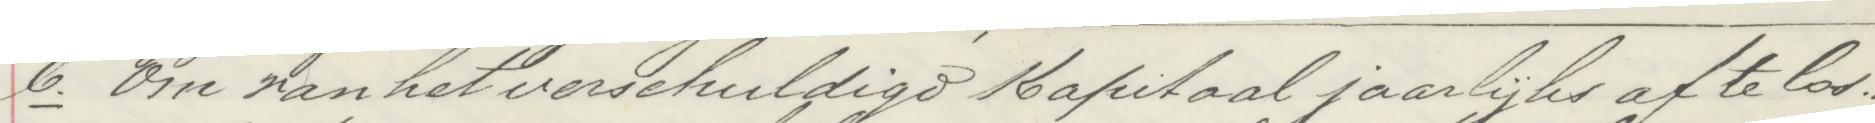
b. Om van het verschuldigd Kapitaal jaarlijks af te los„
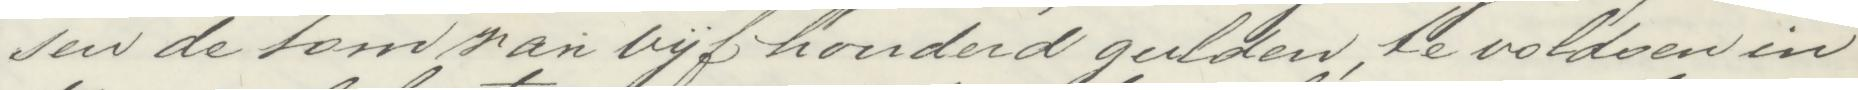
sen de som van vijf honderd gulden, te voldoen in
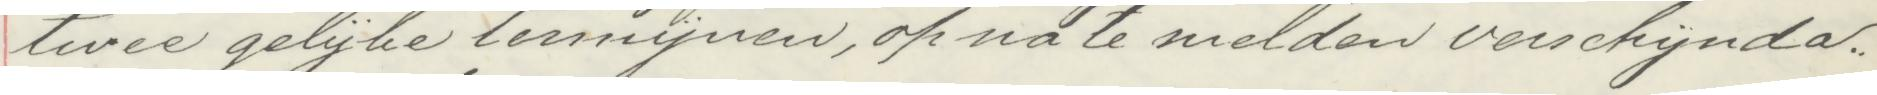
twee gelijke termijnen, op na te melden verschijnda„
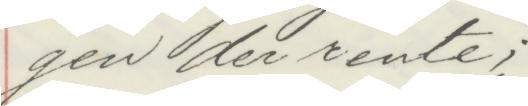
gen der rente;
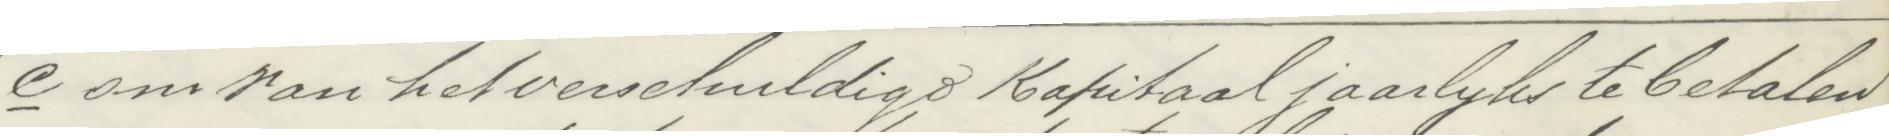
C om van het verschuldigd Kapitaal jaarlyks te betalen
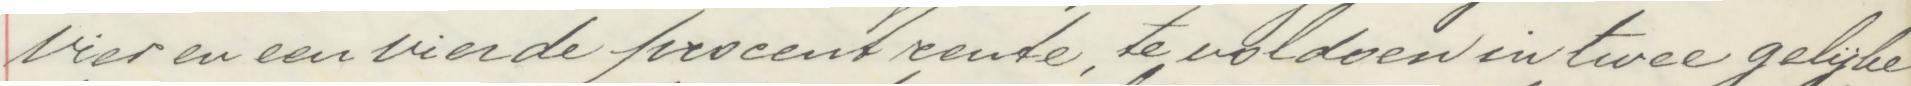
vier en een vierde procent rente, te voldoen in twee gelijke
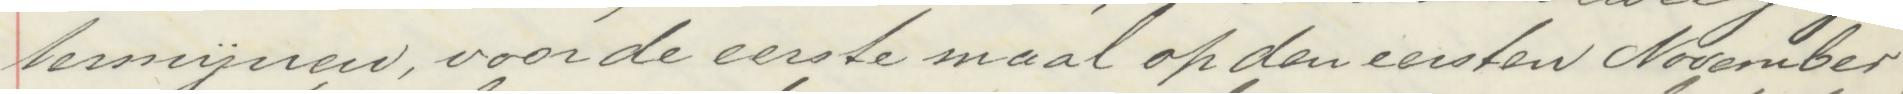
termijnen, voor de eerste maal op den eersten November
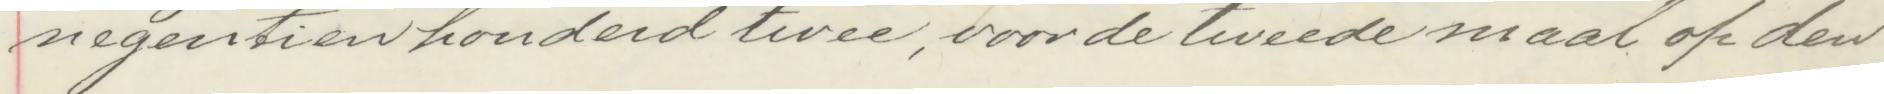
negentien honderd twee, voor de tweede maal op den
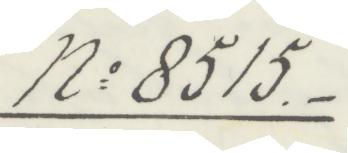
N:o 8515.-
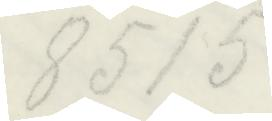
8515
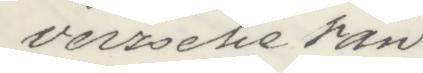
verzoeke van
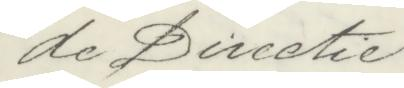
de Directie
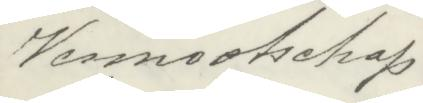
Vennootschap
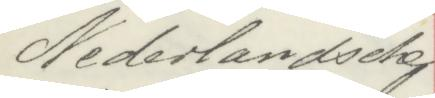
Nederlandsche
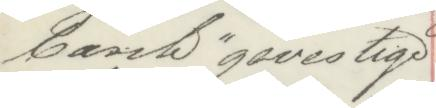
bank" gevestigd
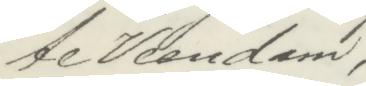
te Veendam,
